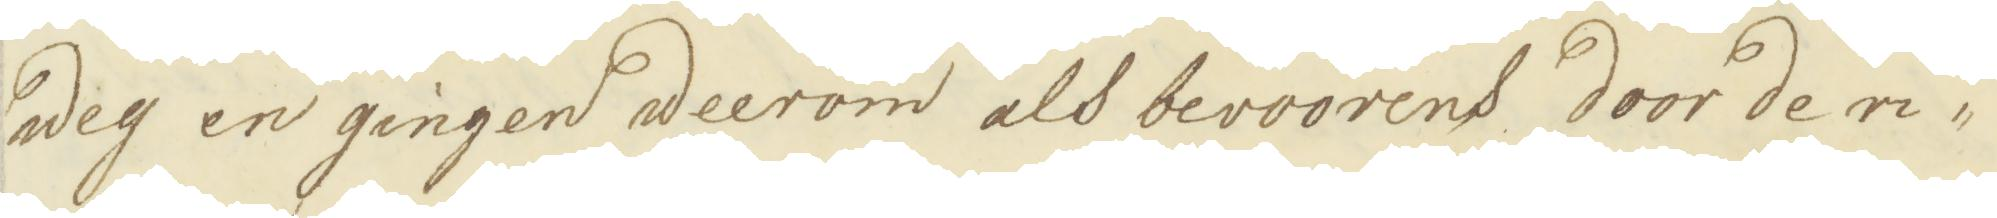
weg en gingen weerom als bevoorens door de ri„
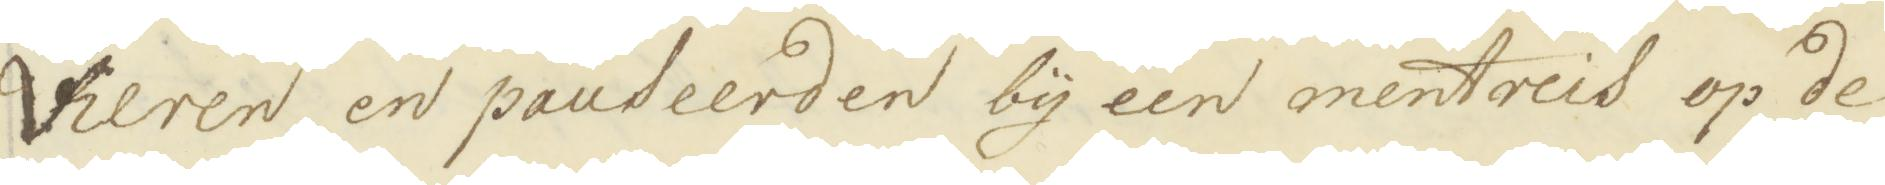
vieren en pauseerden bij een mentreis op de
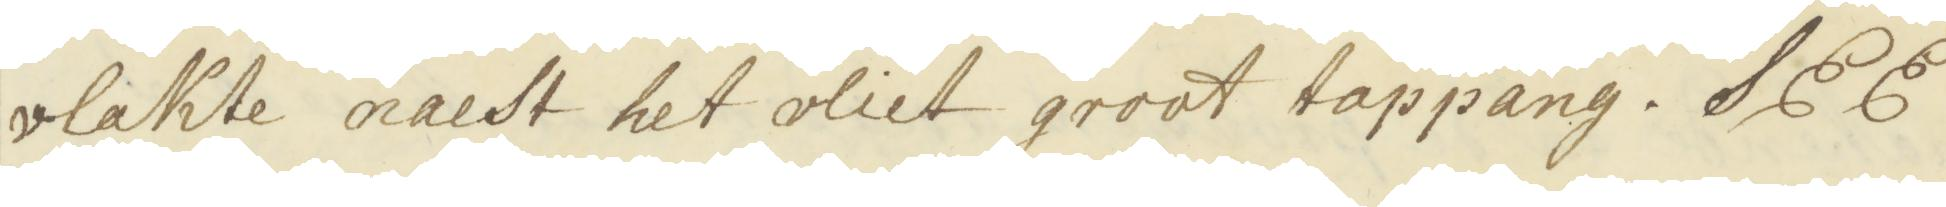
vlakte naest het vliet groot tappang. SEE
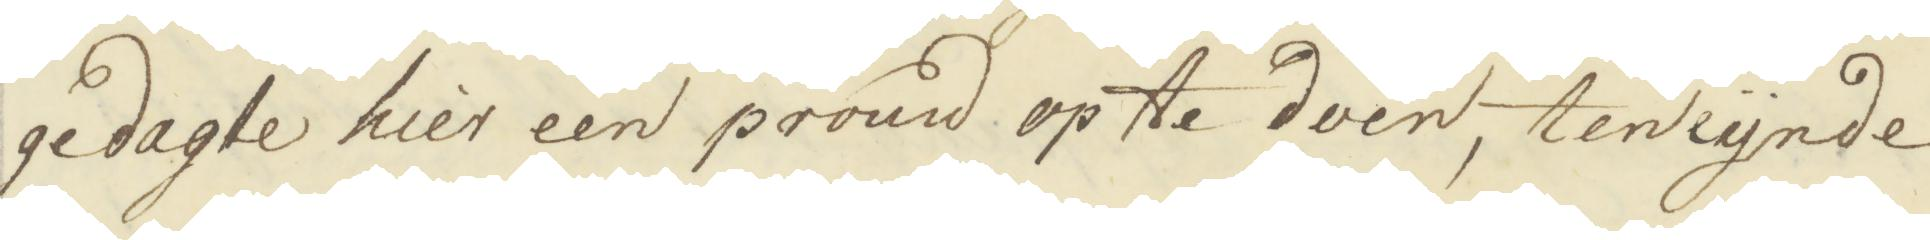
gedagte hier een prouw op te doen, ten eijnde
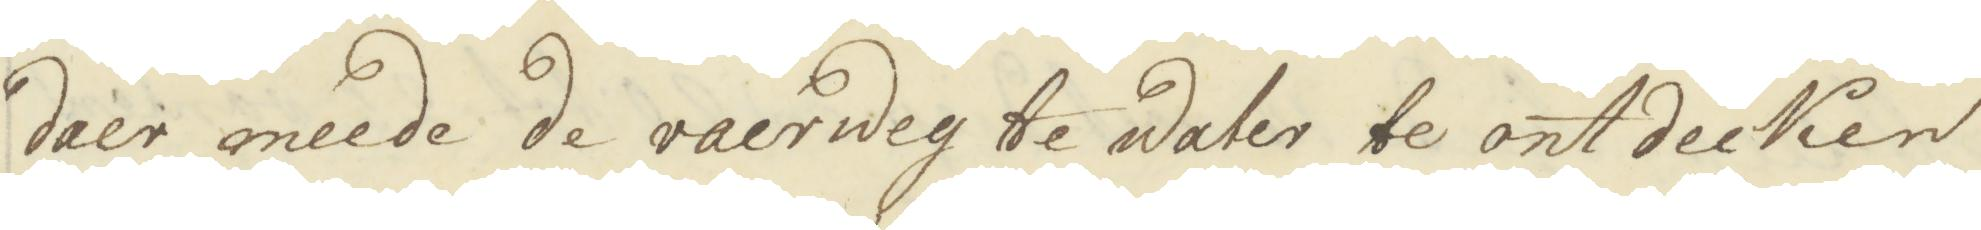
daer meede de vaerweg te water te ontdecken
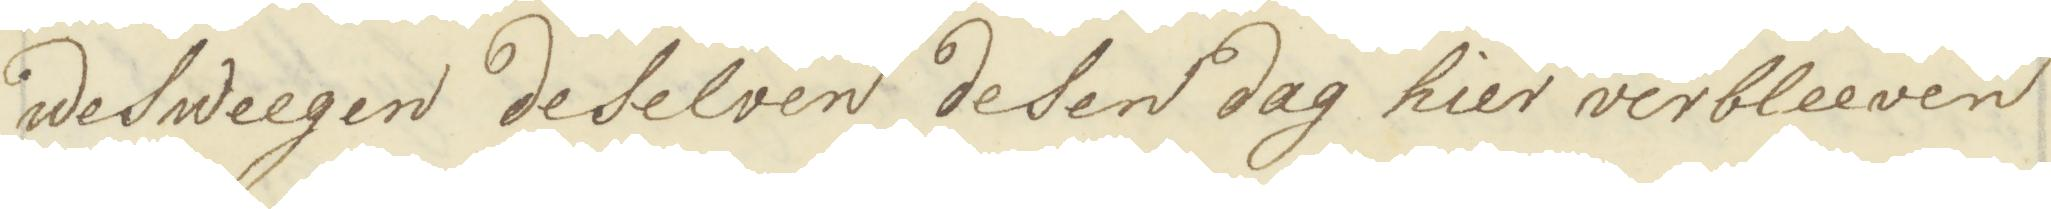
wesweegen deselver desen dag hier verbleeven
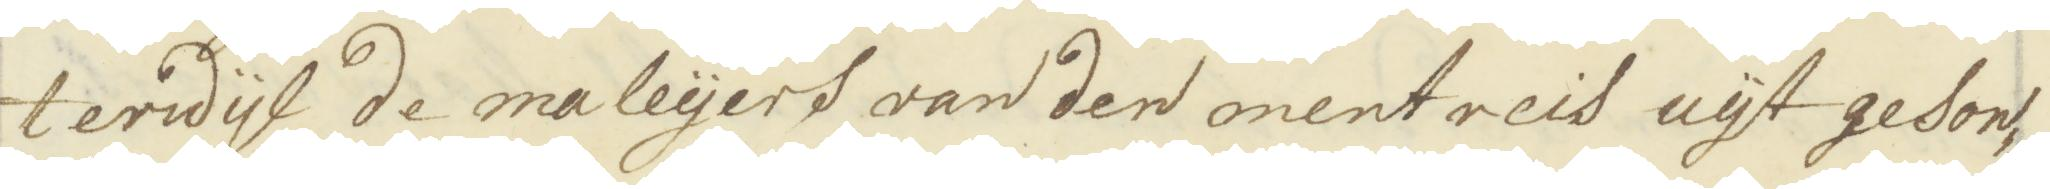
terwijl de maleijers van den mentreis uijt geson„
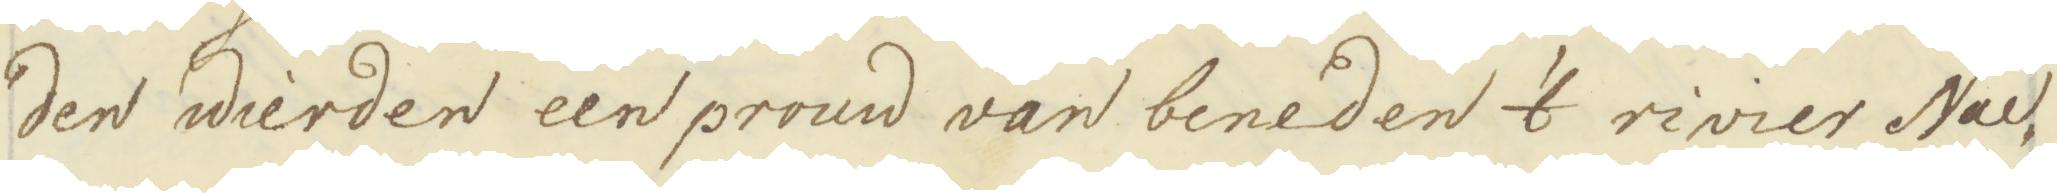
den wierden een prouw van beneden ’t rivier Nae„
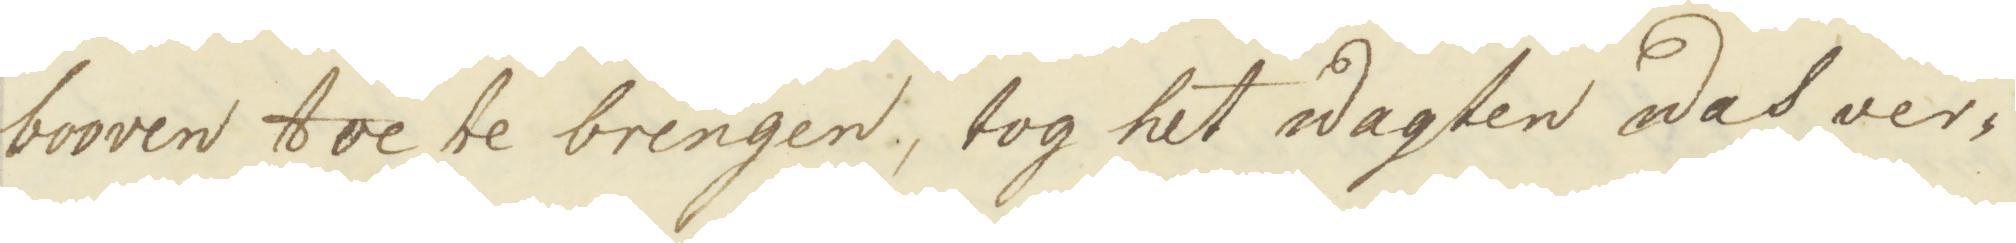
booven toe te brengen, tog het wagten was ver„
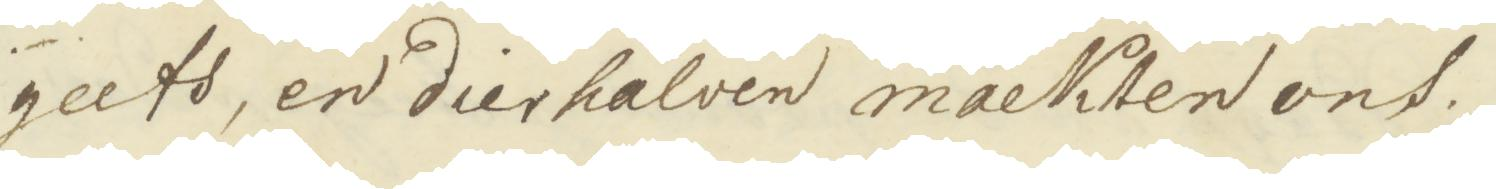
geefs, en dierhalven maekten ons.
